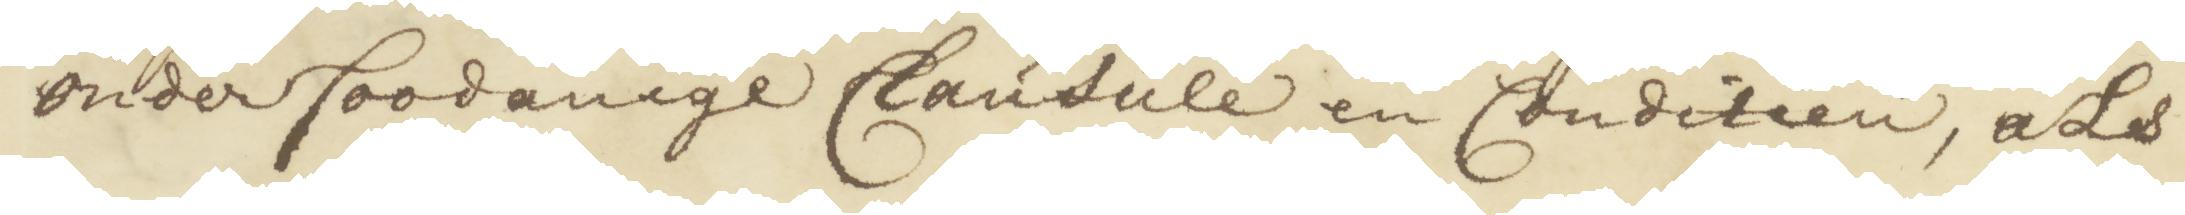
onder soodanige Clausule en Conditien, als
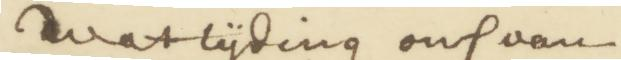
wat tijding ons van
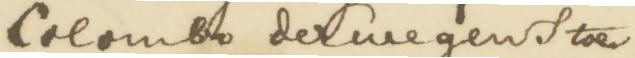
colombo derwegens toer
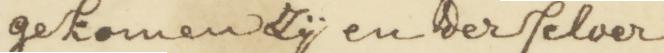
gekomen zij en deselver
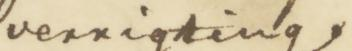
verrigting
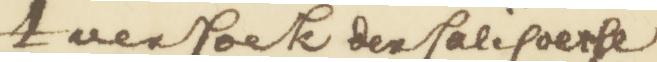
t versoek der Calicoerse
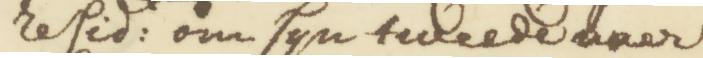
resid:t om syn tweede naer
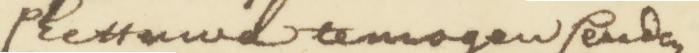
Chettawe te mogen senden
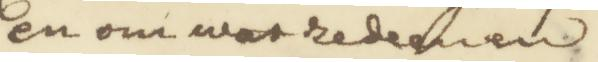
en om wat redeenen
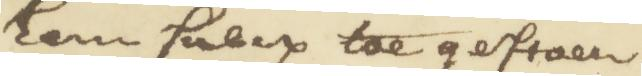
hem sulcx toe gestaen
